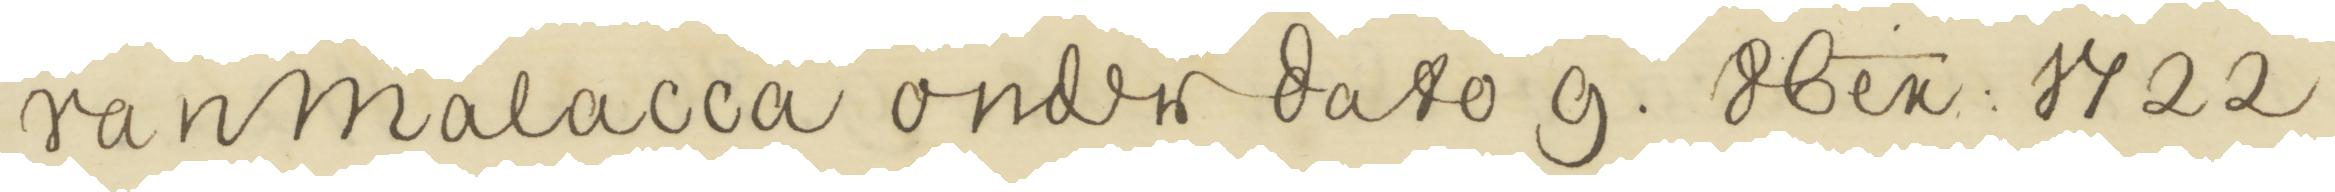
van malacca onder dato 9.' 8ber: 1722
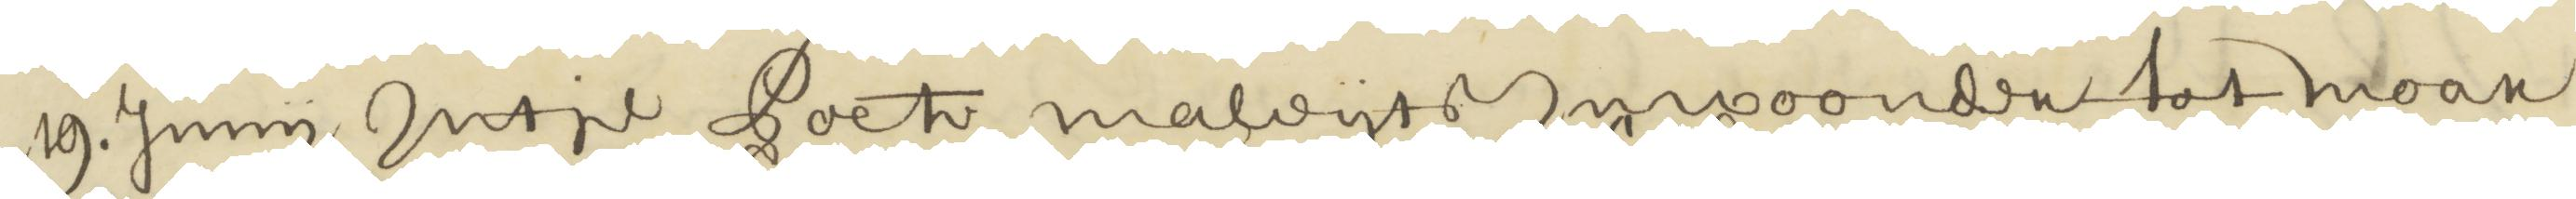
19. Junij jntje Poete maleijts jnwoonder tot moar
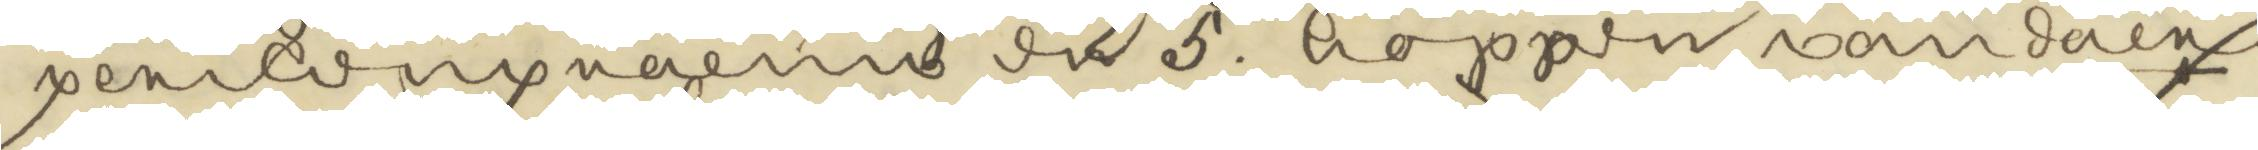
per Een praeuw en 5. koppen van daer
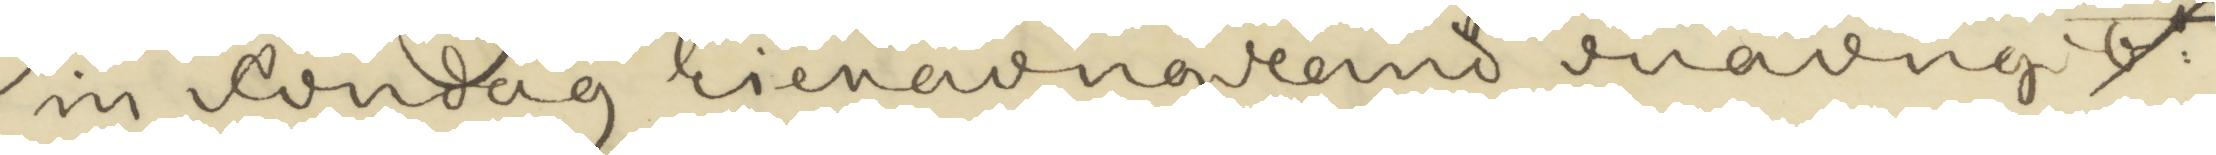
in Een dag hier aengeland en aengeb:t
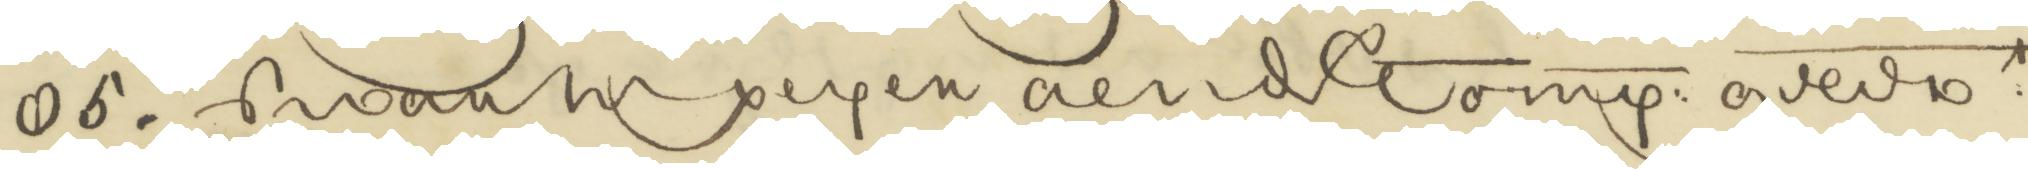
85. swarte peper aen de EComp: gelev:t
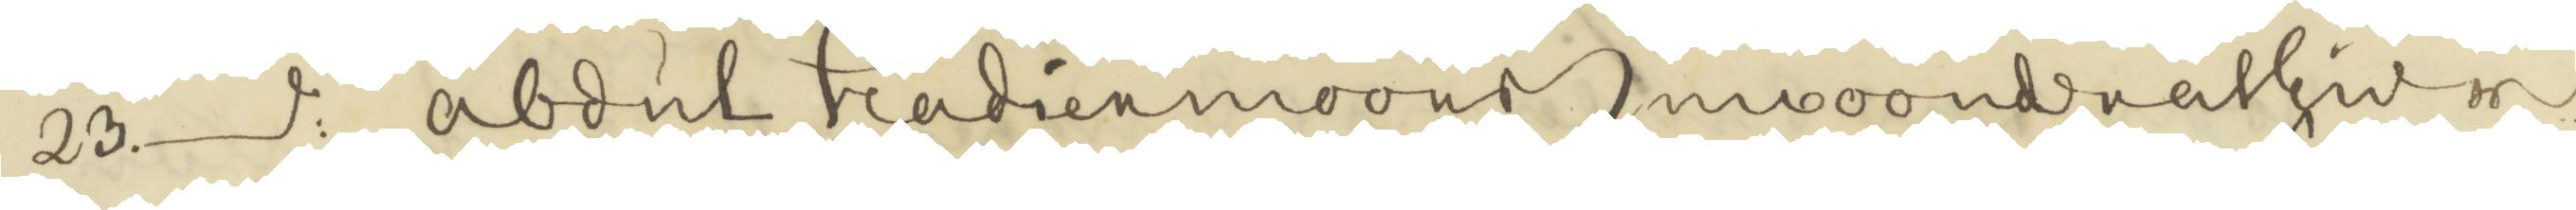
23._:o abdul kadier moors jnwoonder alhier
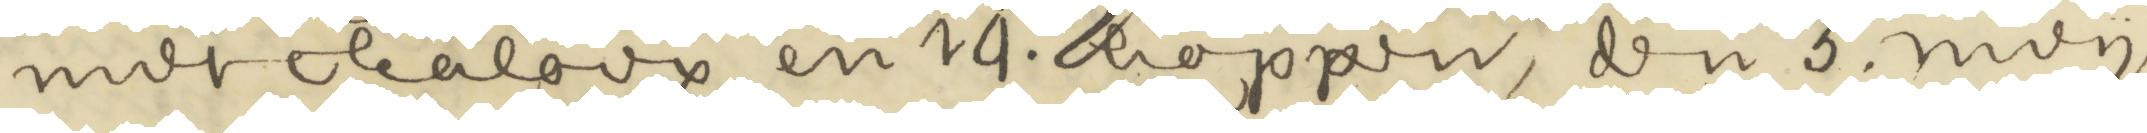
met Chaloep en 14. koppen, den 3. meij
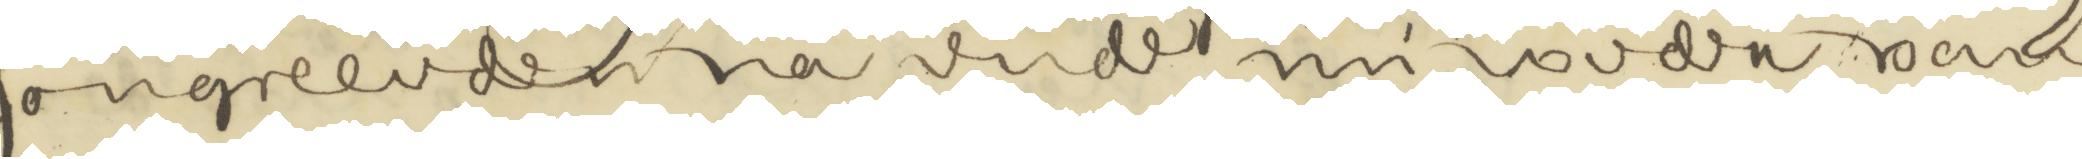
Jongstleden na ende nu weder van
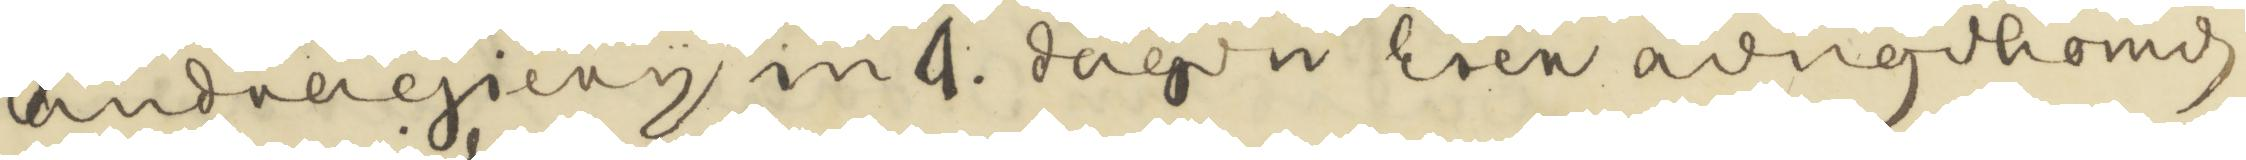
andragierij in 4. dagen hier aengekomen
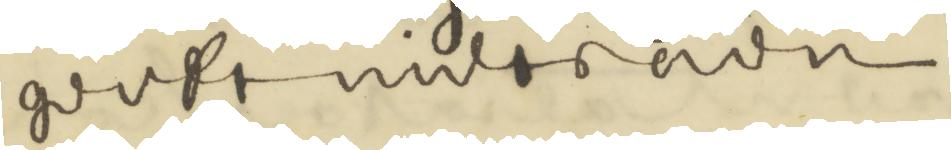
geeft niets aen
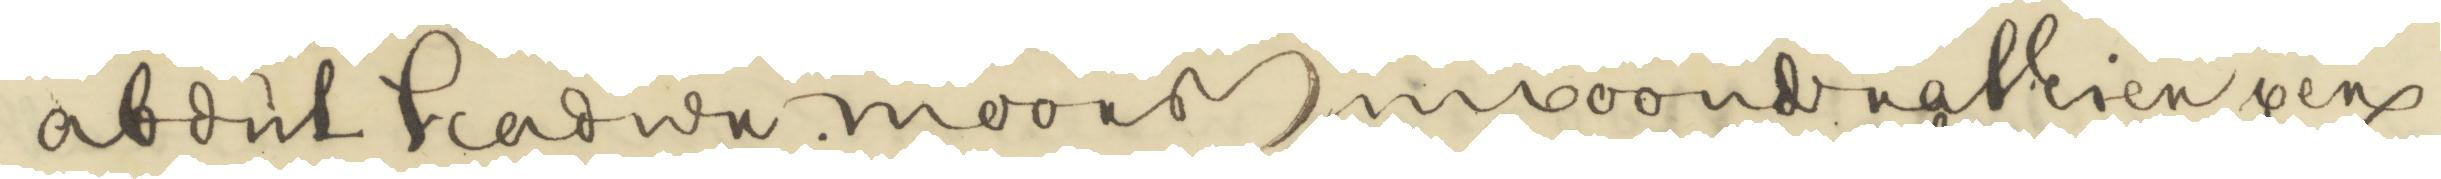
abdul kadier moors jnwoonder alhier per
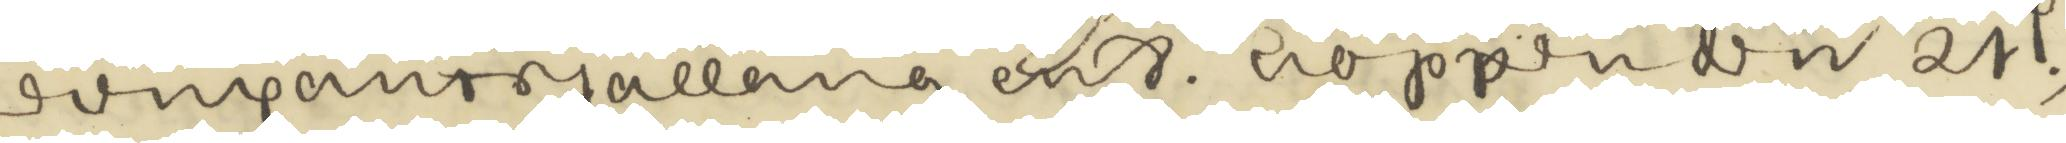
een pantsjallang en 8. coppen den 21.
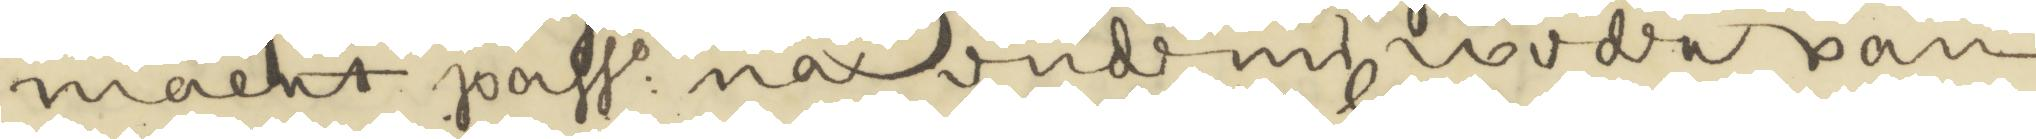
maert pass:o na ende nu weder van
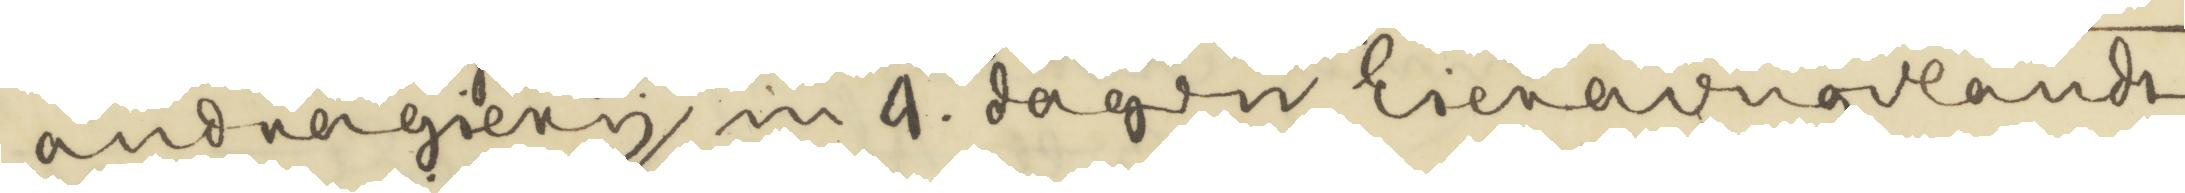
andragierij in 4. dagen hier aengelandt
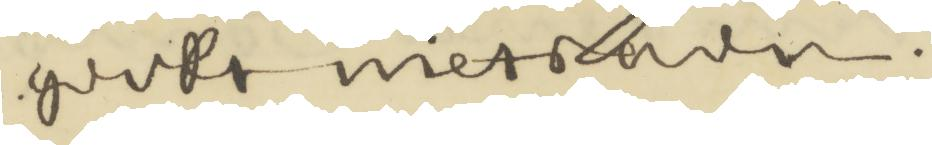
geeft niets aen.
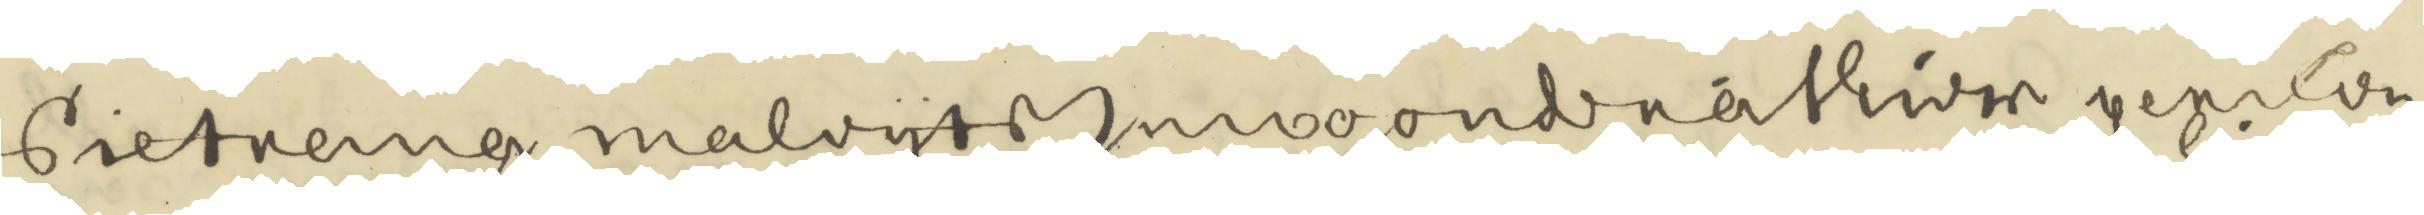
sietrang maleijts jnwoonder alhier per Een
